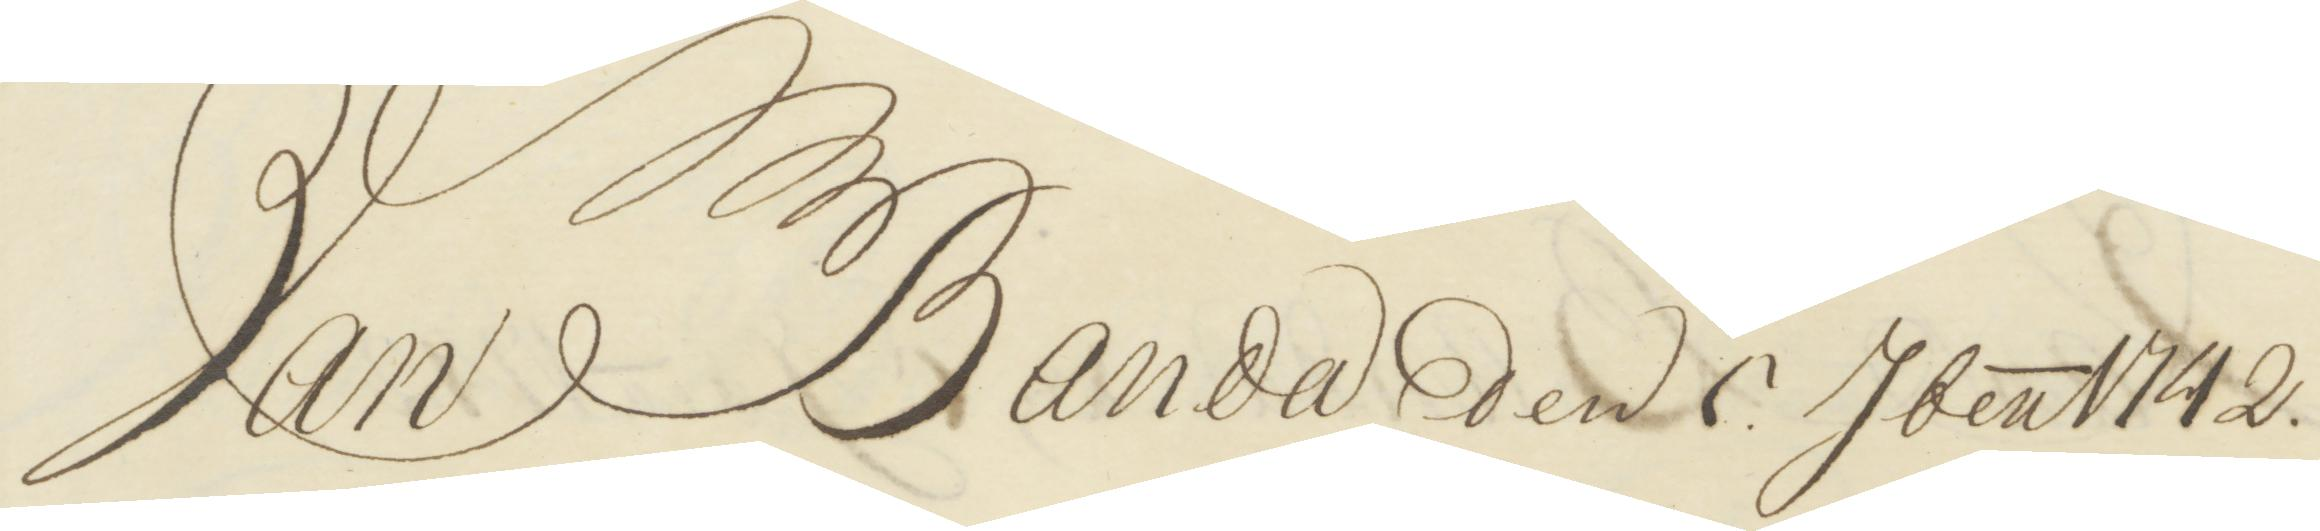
Van Banda den 5: Jber1742.
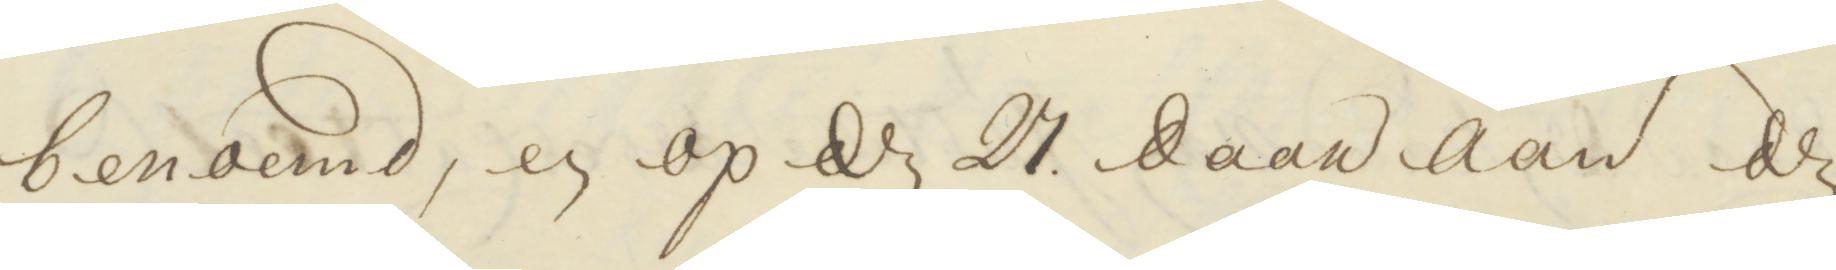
benoemd, en op den 27. daar aan den
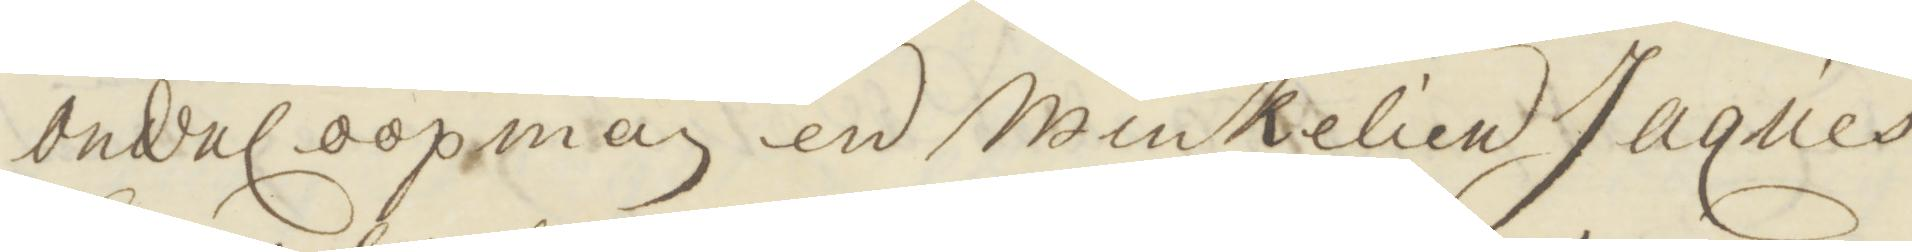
ondercoopman en winkelier Jaques
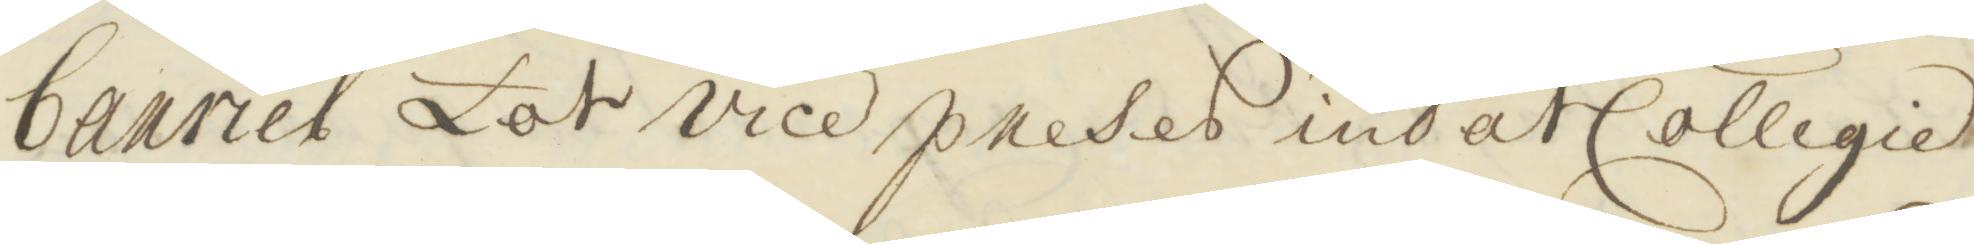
barriel tot vice preses in dat Collegie
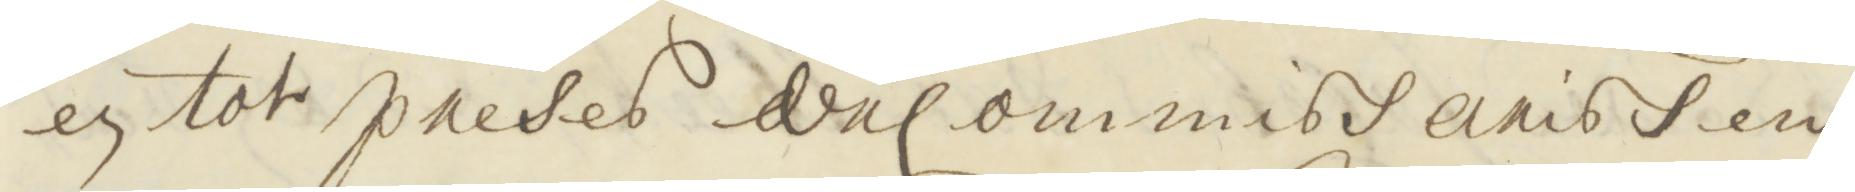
en tot preses derCommissarissen
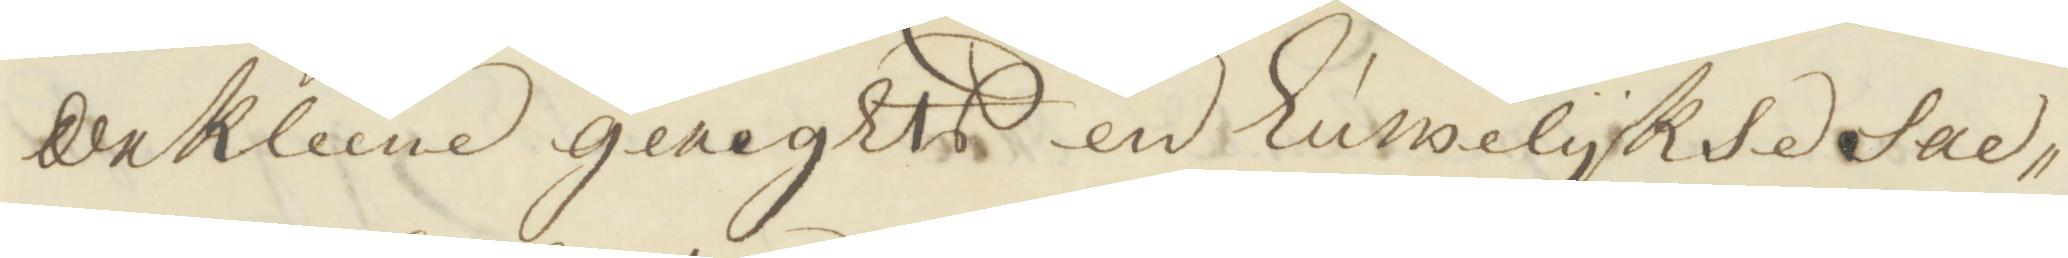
derkleene gereghts en huwelijkse sae„
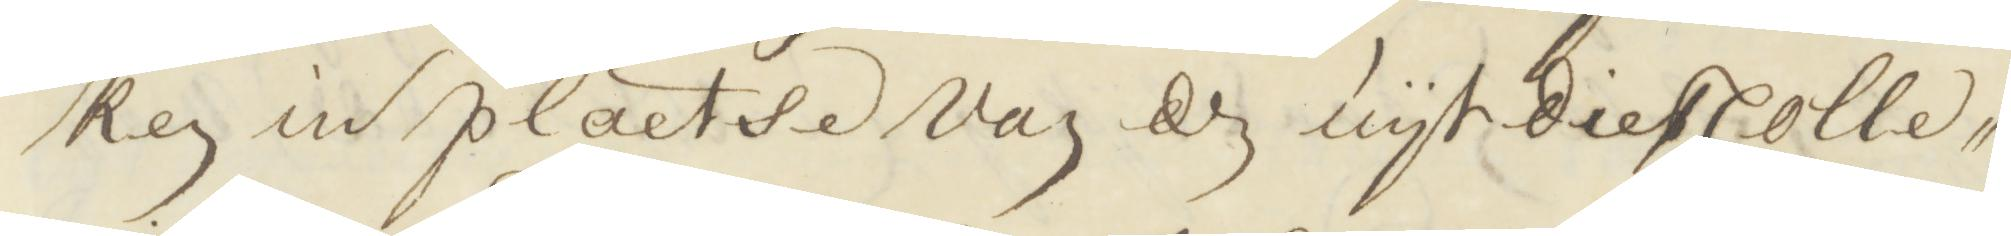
ken in plaetse van den uijt dies colle„
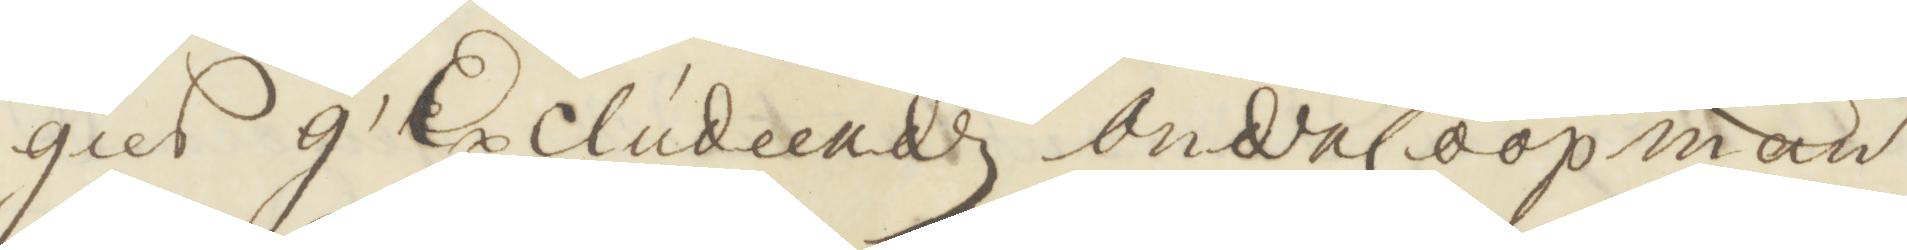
gies g’Excludeerden ondercoopman
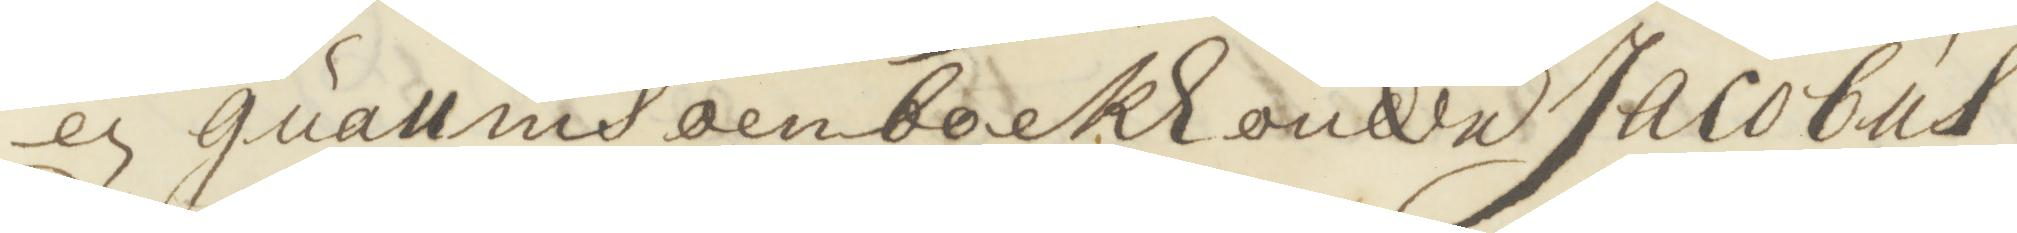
en guarnisoenboekhouder Jacobus
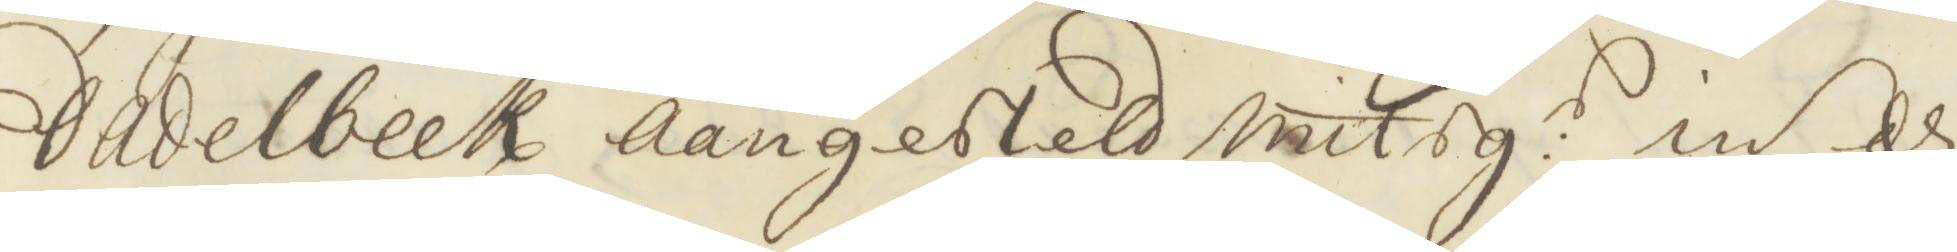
dadelbeek aangesteld mitsg:s in den
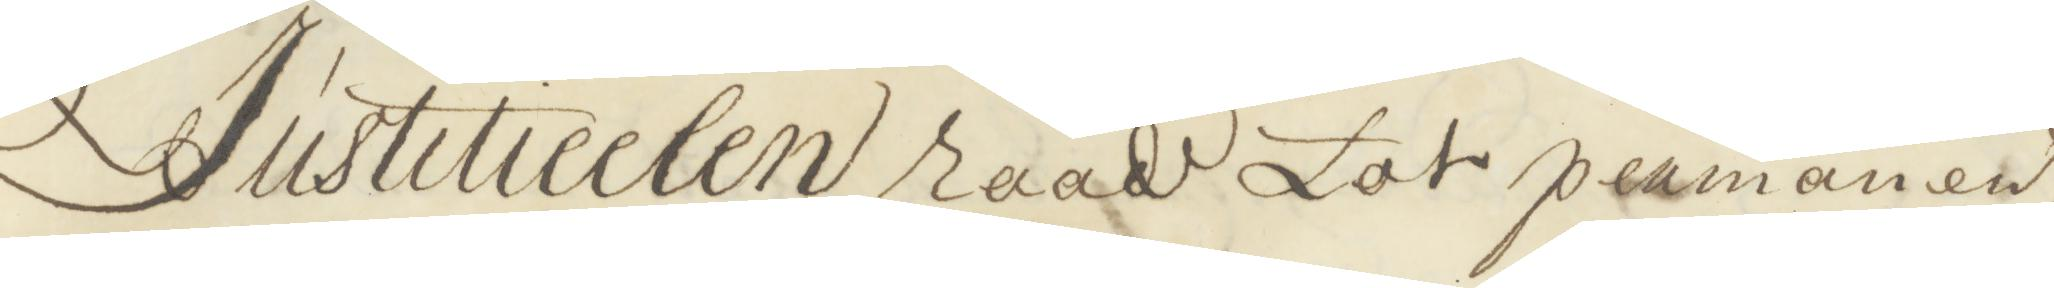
Justitieelen raade tot permanen
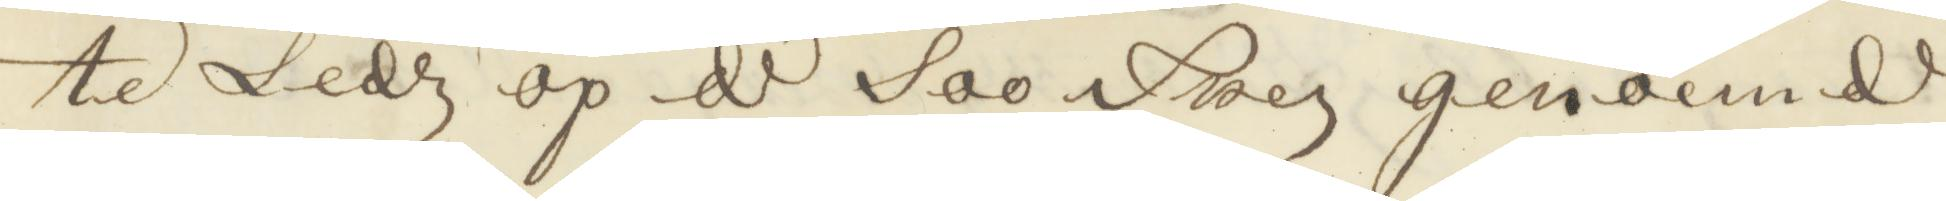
te leden op de soo even genoemde
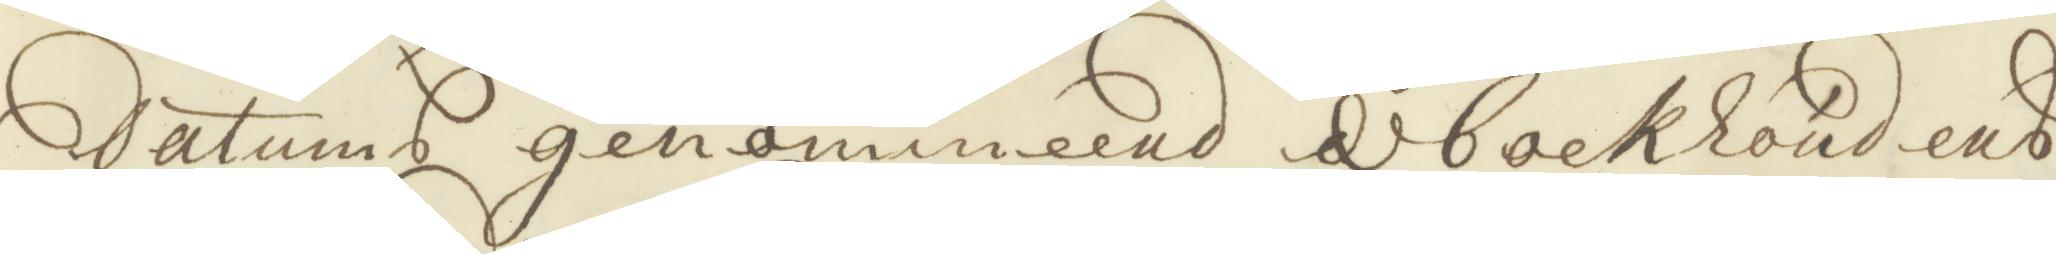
datums genomineerd deboekhouders
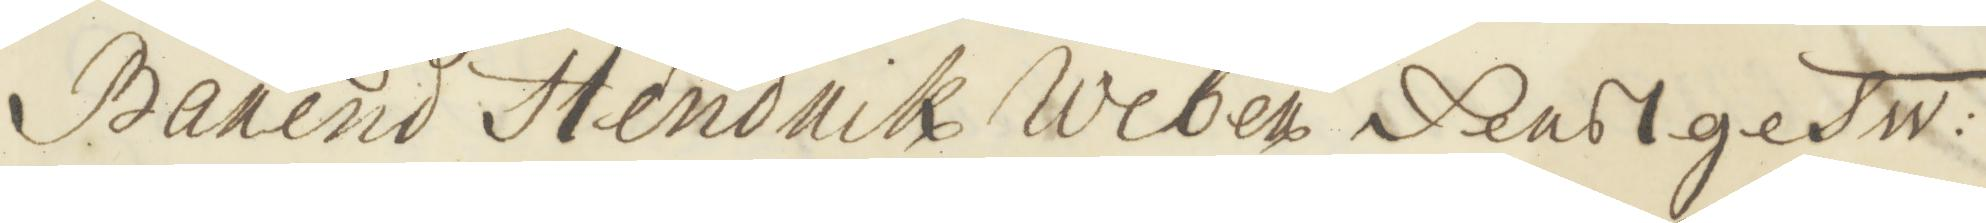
Barend Hendrik Weber eerst gesw:
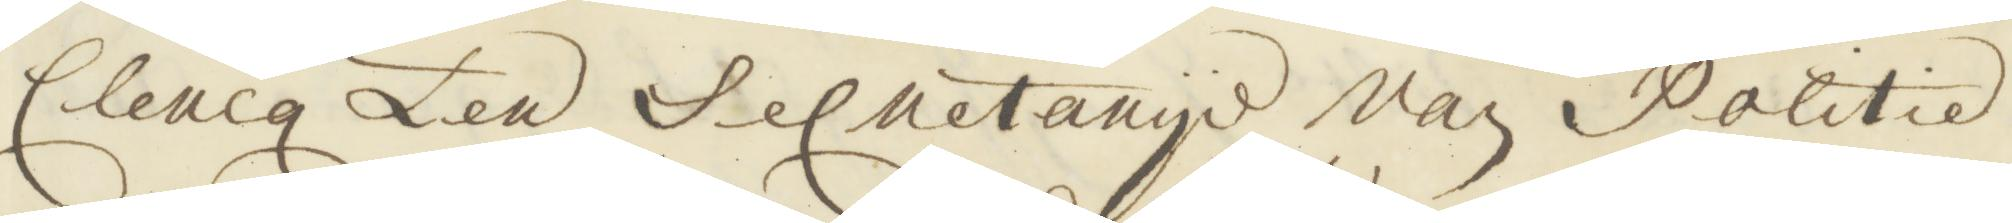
clercq ter secretarije van Politie
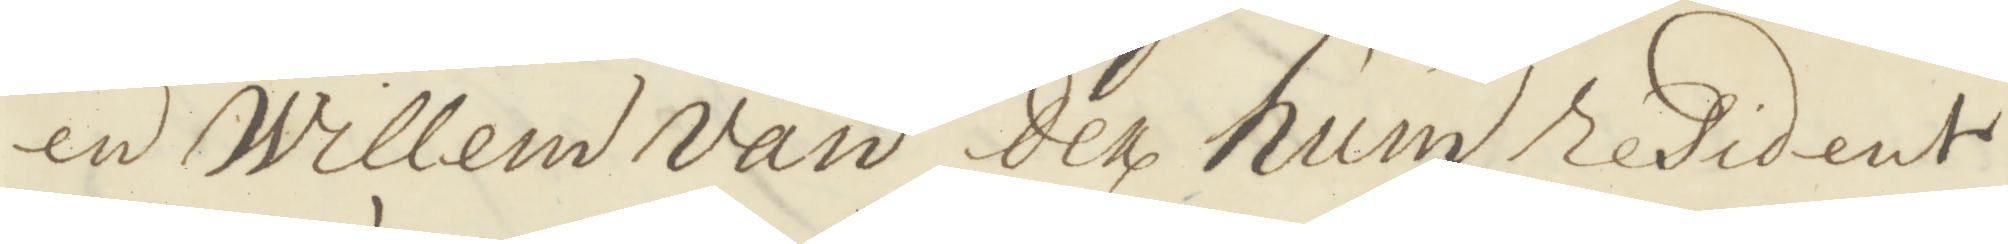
en Willem van der hum resident
